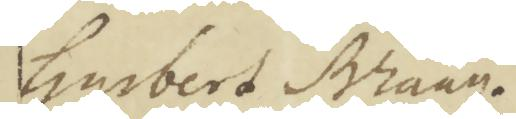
Gysbert Braay.
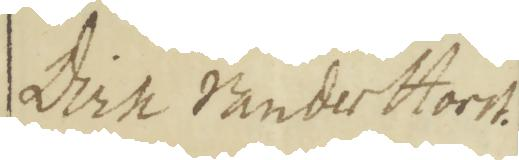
Dirk van der Horst.
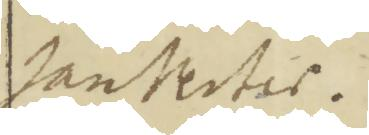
Jan Vester.
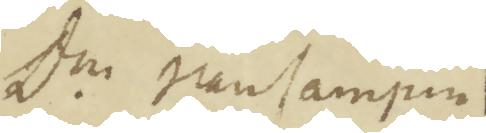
D.m van Campen
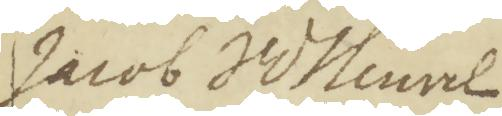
Jacob Vd Heuvel
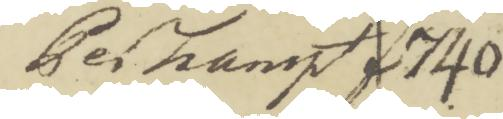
Per Transpt ƒ 740
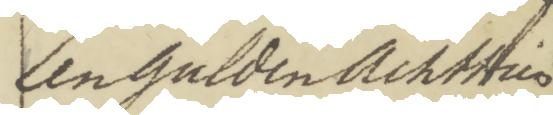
Een gulden Achttien
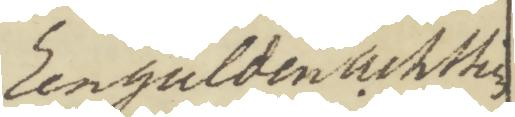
Een gulden achttien
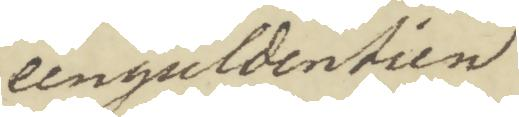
een gulden tien
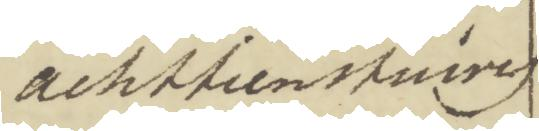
achttien stuivers
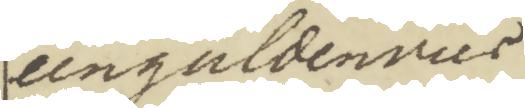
een gulden vier
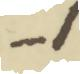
—1
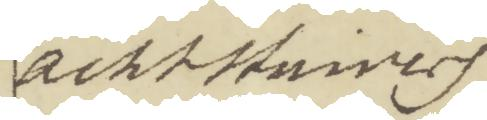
acht stuivers
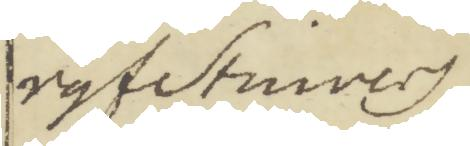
vyf Stuivers
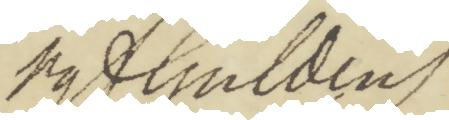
Vyf Guldens
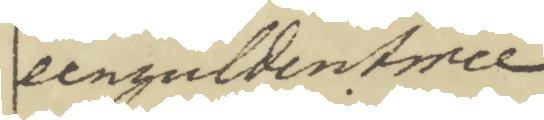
een gulden twee
